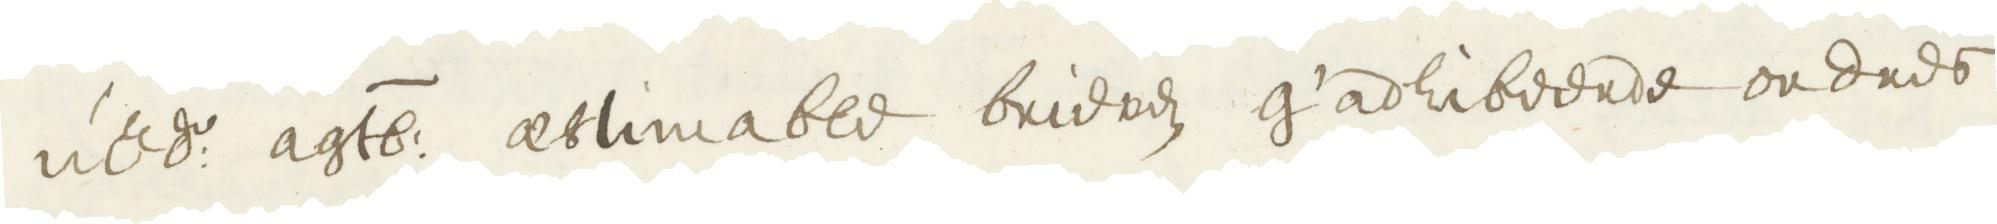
uEd:e agtb: aestimable brieven g’adhibeerde ordres
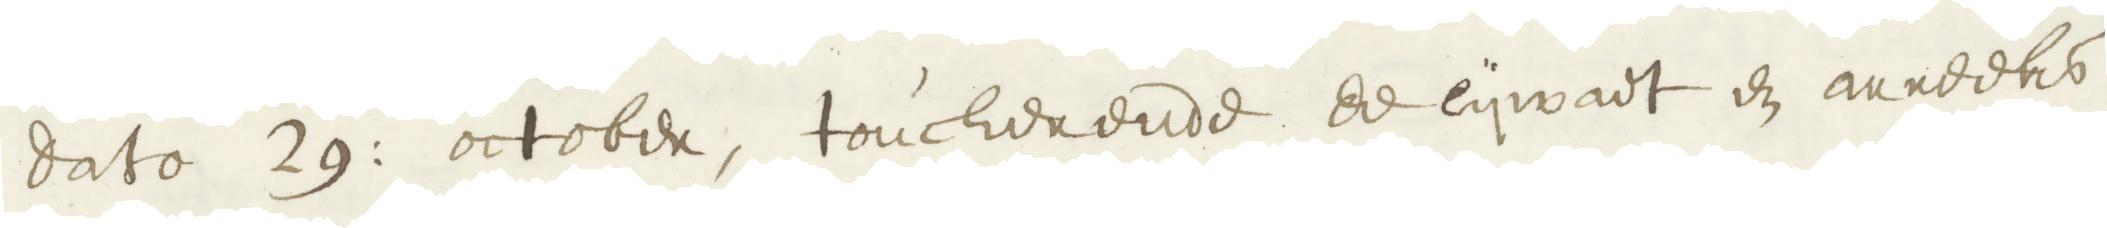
dato 29: october, toucherende de lijwaet en arreeks
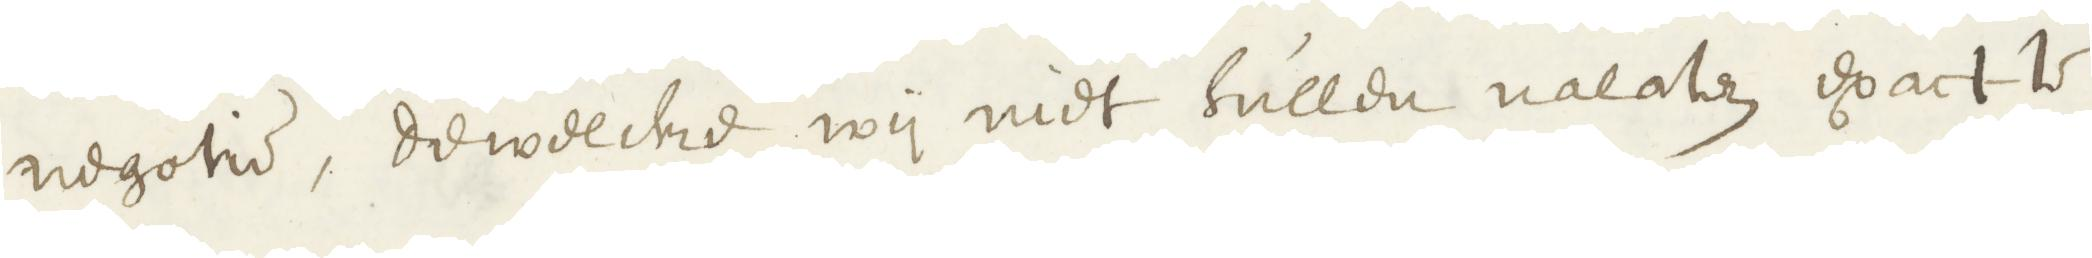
negotie, dewelcke wij niet sullen nalaten exact te
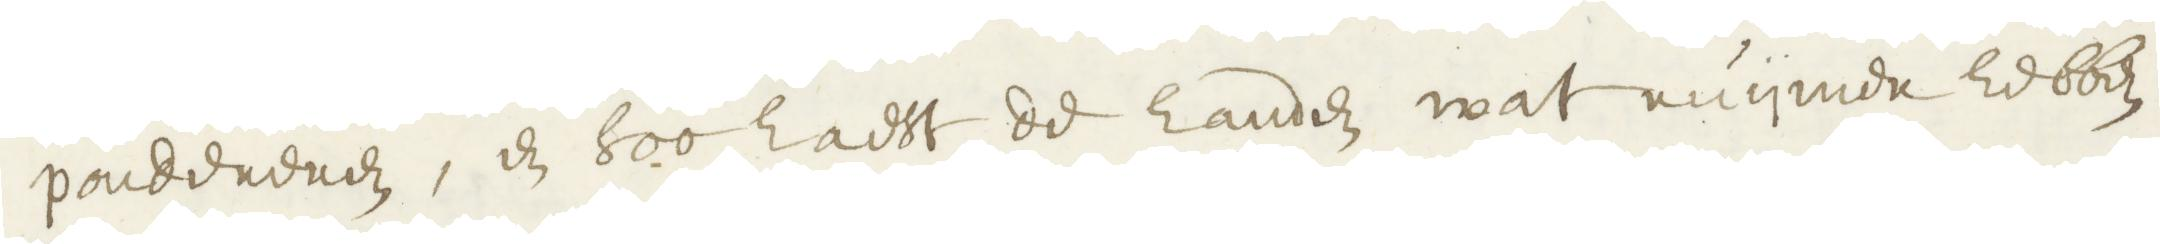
pondereren, en soo haeft de handen wat ruijmer hebben
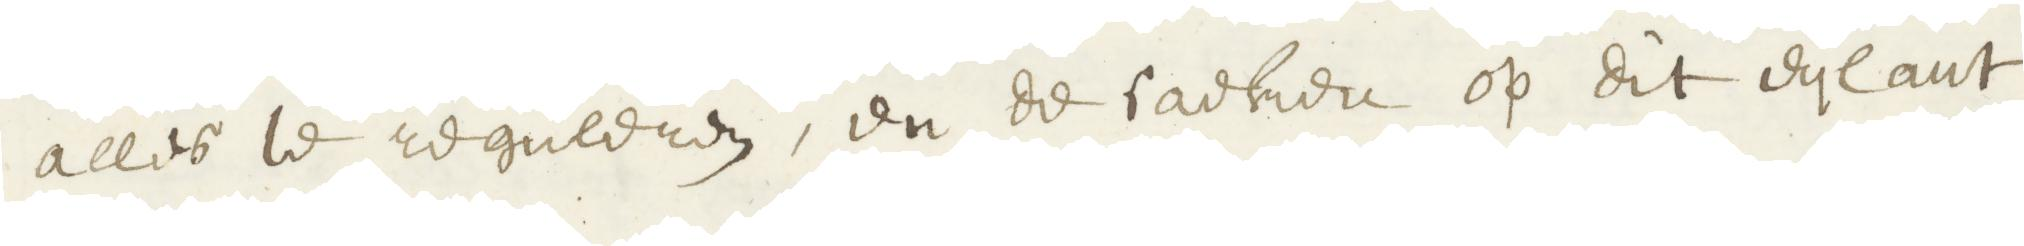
alles te reguleren, en de saeken op dit eijlant
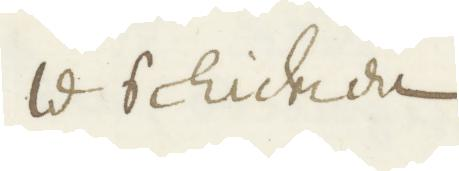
te schicken
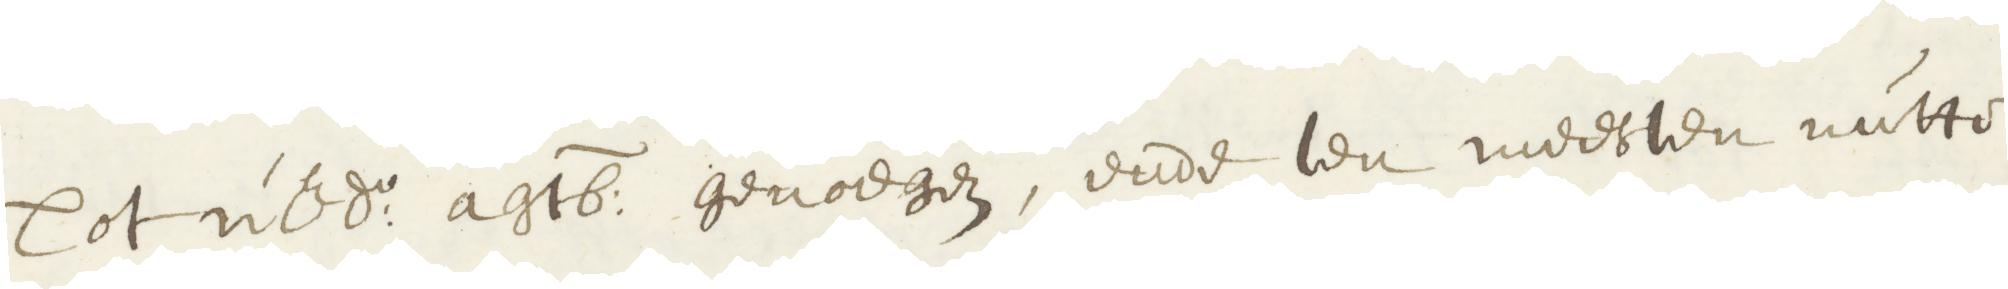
Tot uEd:e agtb: genoegen, ende ten meesten nutte
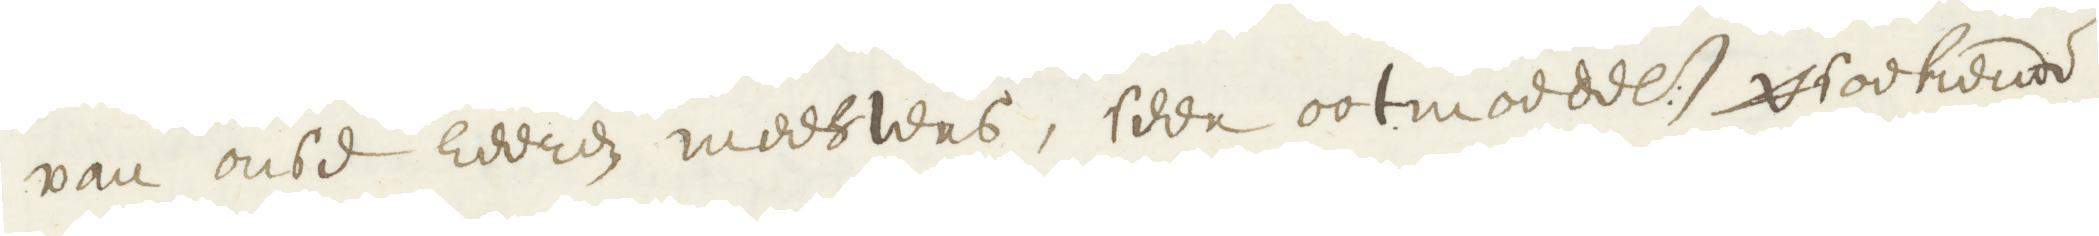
van onse heeren meesters, seer ootmoedelijk versoekende
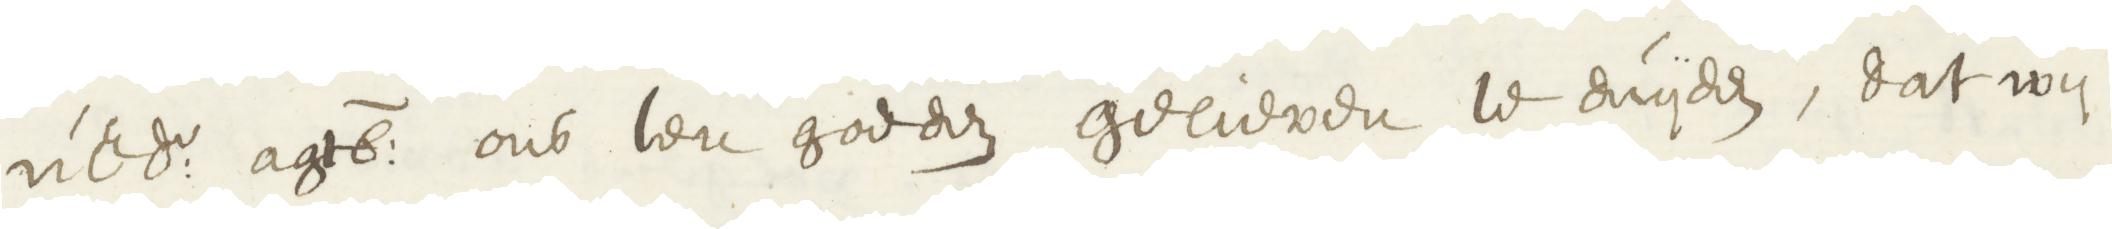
uEd:e agtb: ons ten goeden gelieven te duijden, dat wij
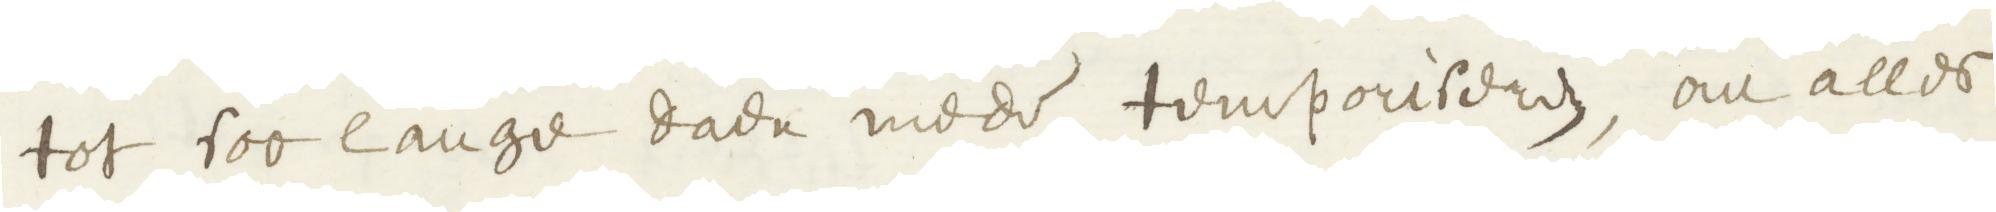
tot soo lange daer mede temporiseren, om alles
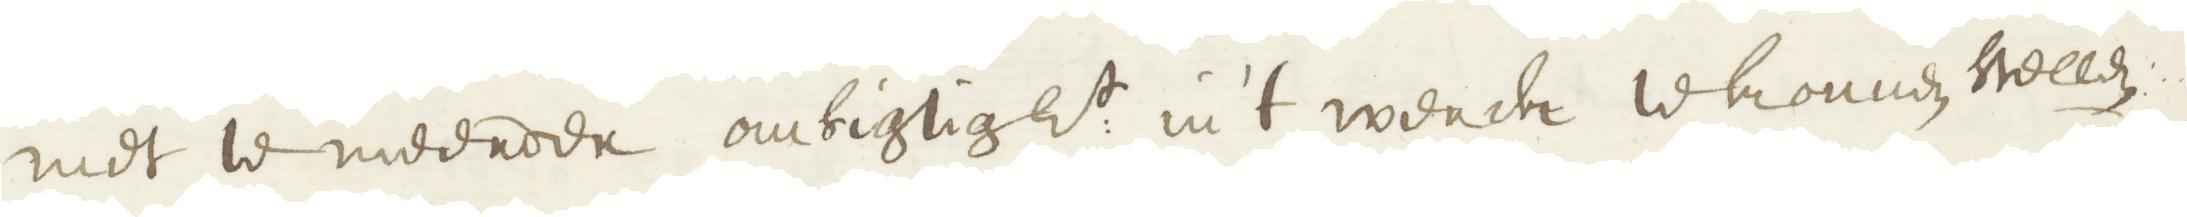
niet te meerder omsigtigh:t in ’t werck te konnen stellen
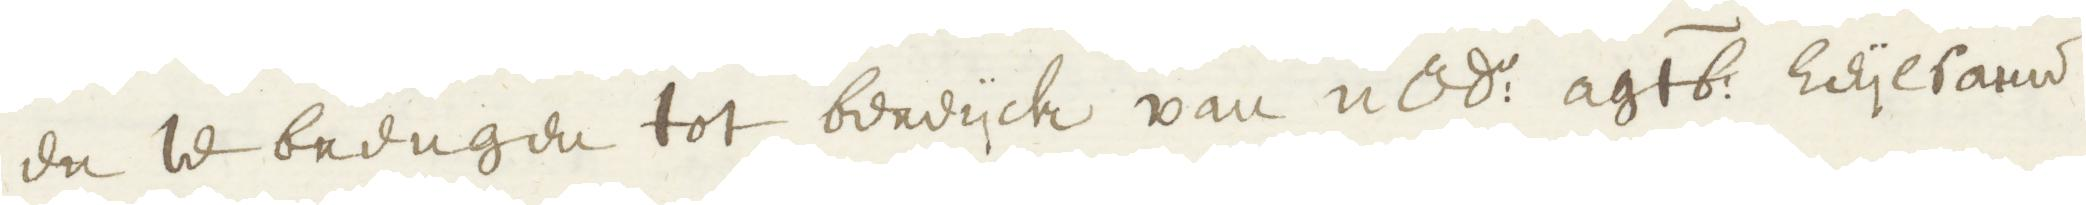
en te brengen tot bereijck van uEd:e agtb: heijlsame
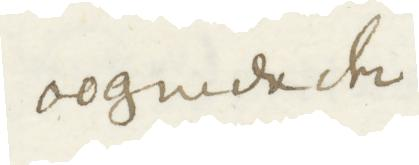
oogmerck
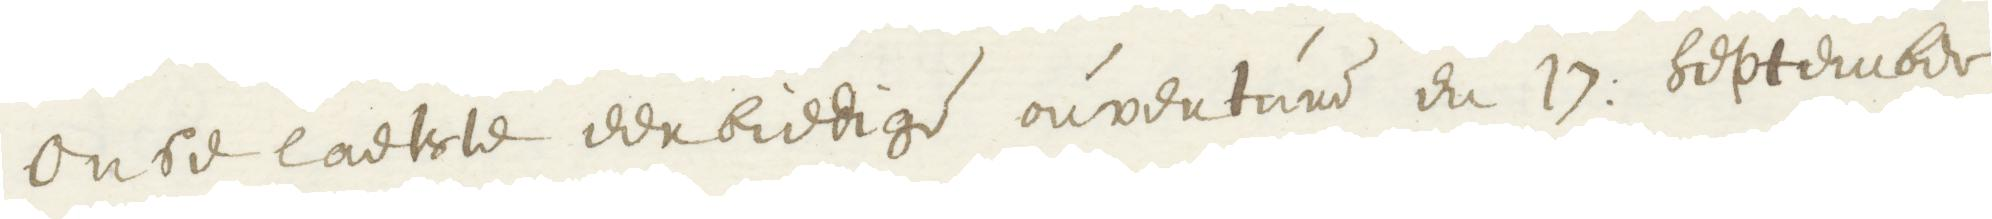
onse laetste eerbiedige ouverture en 17: September
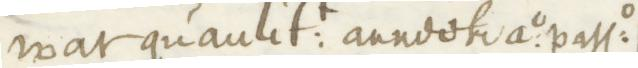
wat quantit:t arreek a:o pass:o
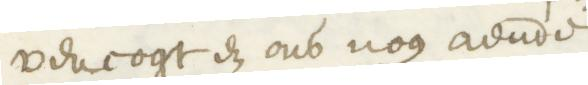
vercogt en ons nog aende
